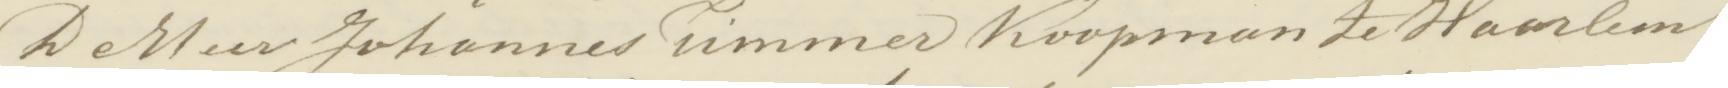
De Heer Johannes Timmer Koopman te Haarlem
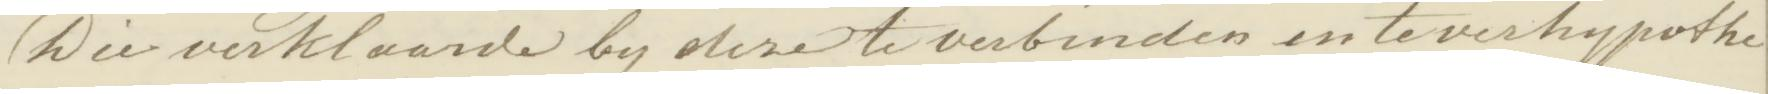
Die verklaarde by deze te verbinden in te verhypothe
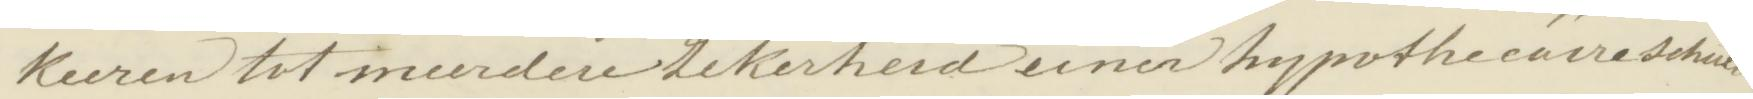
keeren tot meerdere zekerheid eener hypothecaire schuld
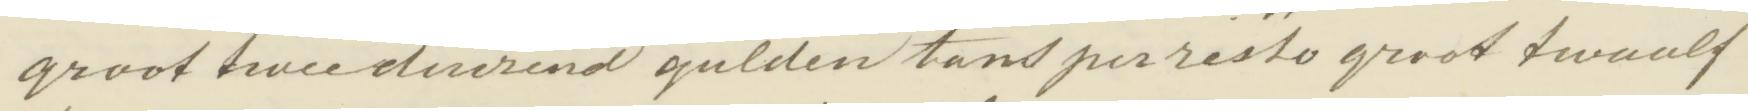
groot twee duizend gulden tans per resto groot twaalf
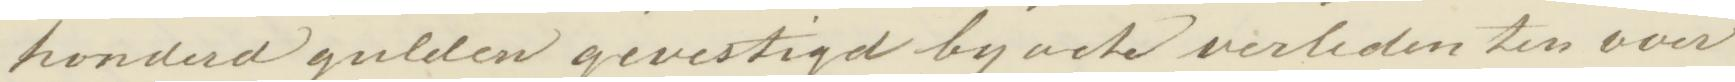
honderd gulden gevestigd by acte verleden ten over
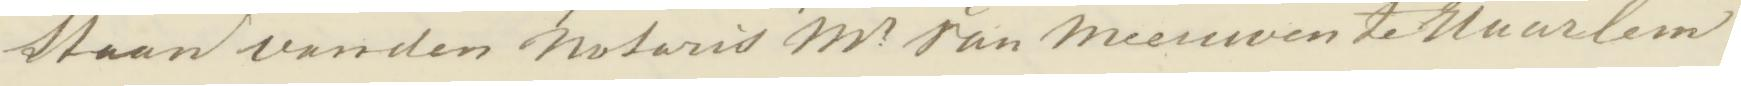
staan van den Notaris M:r van Meeuwen te Haarlem
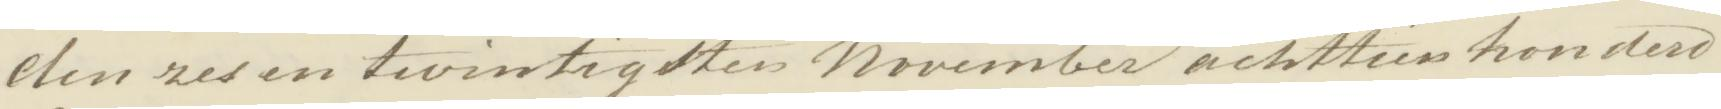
den zes en twintigsten November achttien honderd
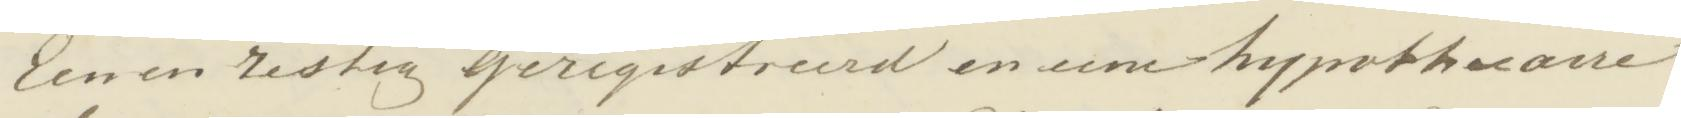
Een en zestig geregistreerd en eene hypothecaire
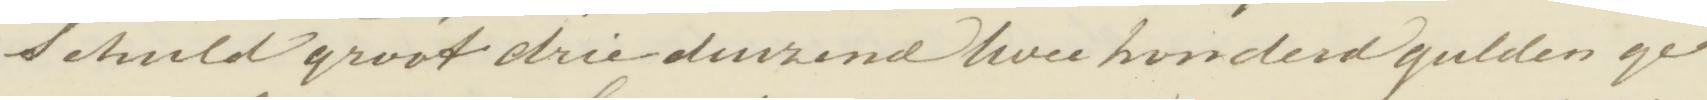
schuld groot drie duizend twee honderd gulden ge
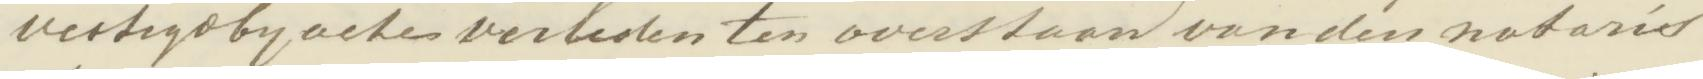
vertigd by acte verleden ten overstaan van den notaris
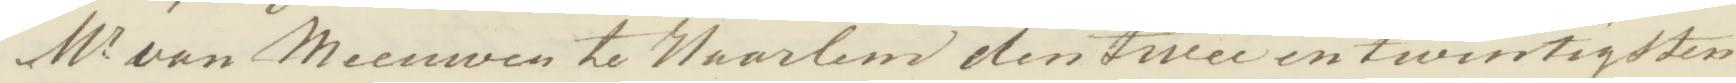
M:r van Meeuwen te Haarlem den twee en twintigsten
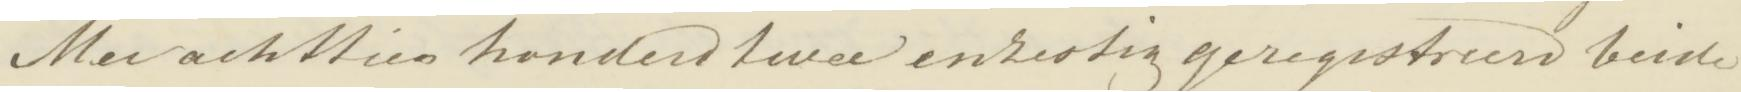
Mei achttien honderd twee en zestig geregistreerd beide
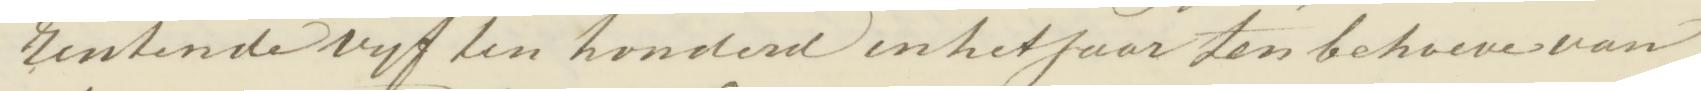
rentende vyf ten honderd in het jaar ten behoeve van
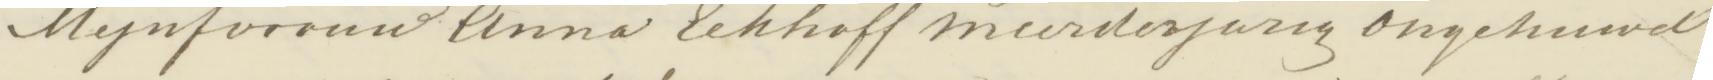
Mejufvrouw Anna Eekhoff meerderjarig ongehuwd
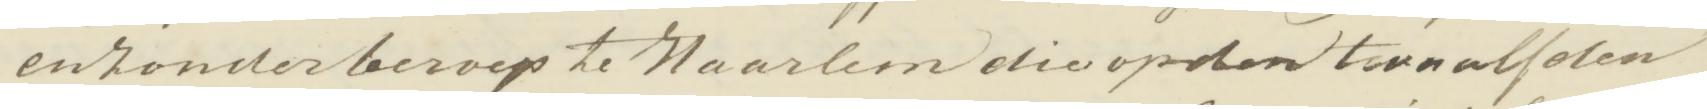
en zonder beroep te Haarlem die op den twaalfden
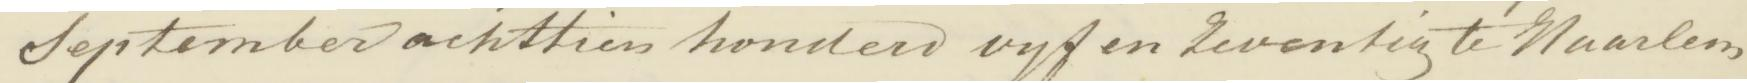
September achttien honderd vyf en zeventig te Haarlem
